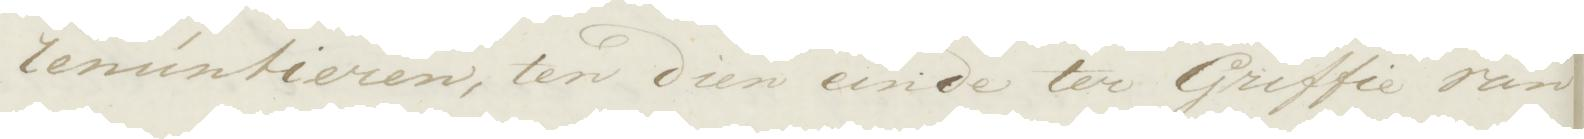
renuntieren, ten dien einde ter Griffie van
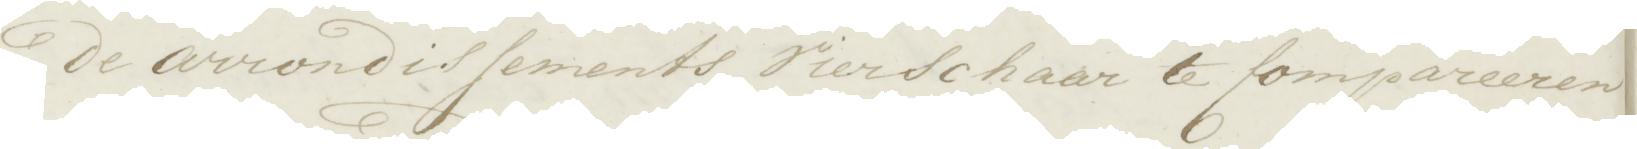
de arrondissements vierschaar te Compareeren
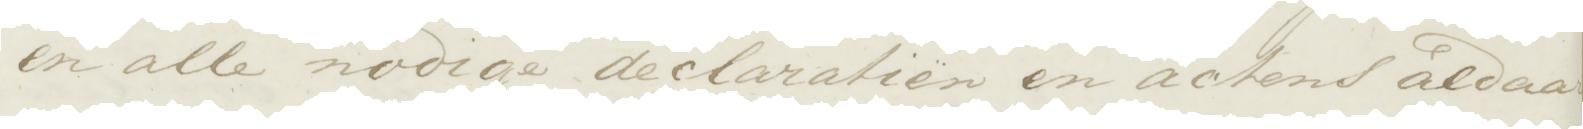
en alle nodige declaratiën en actens aldaar
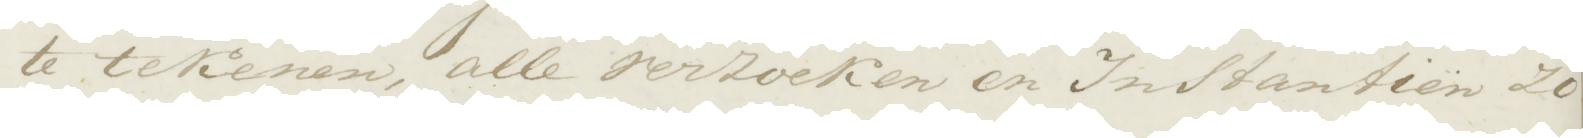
te tekenen, alle verzoeken en Instantiën zo
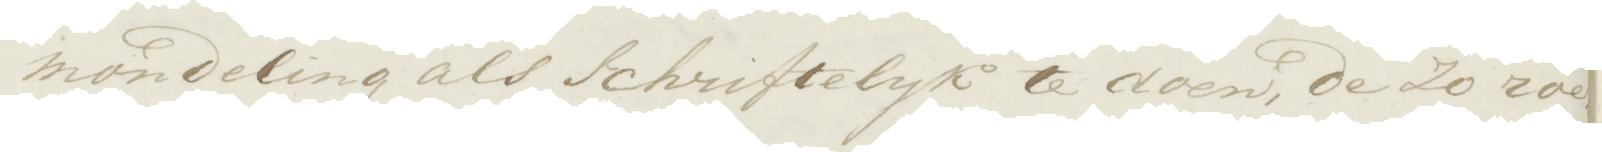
mondeling als schriftelyk te doen, de zo roe
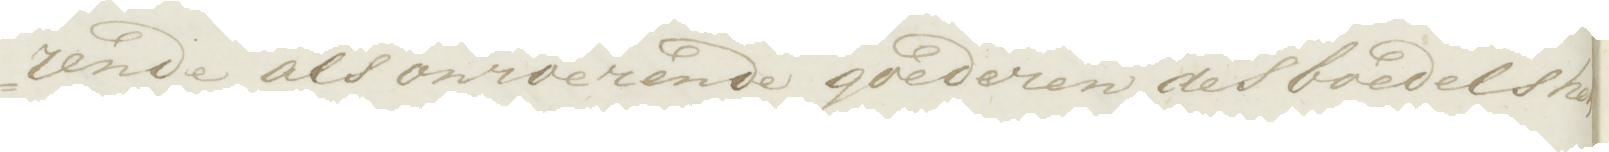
„rende als onroerende goederen des boedels het
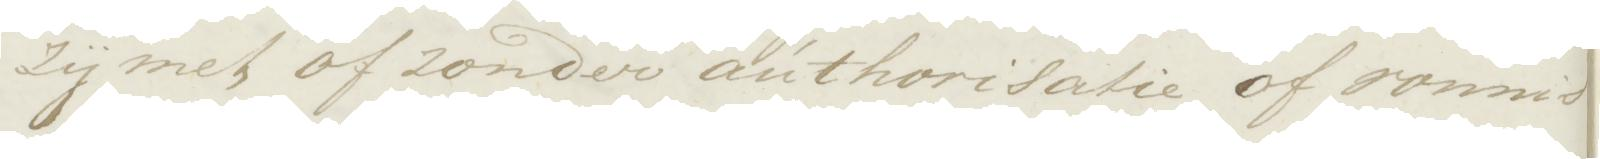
zij met of zonder authorisatie of vonnis
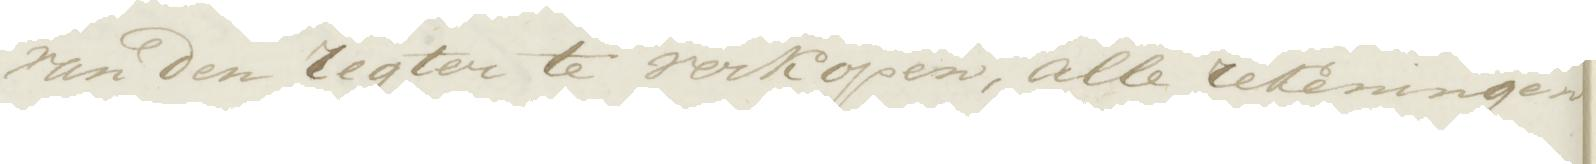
van den regter te verkopen, alle rekeningen
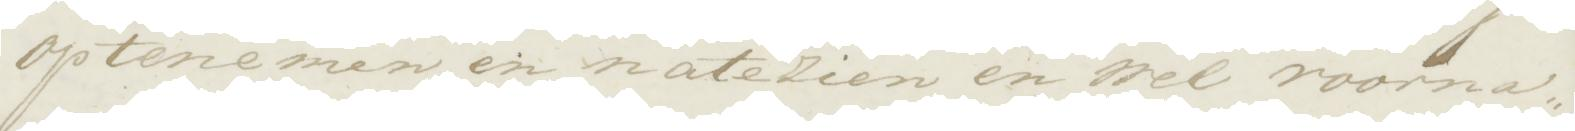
op tenemen en natezien en wel voorna„
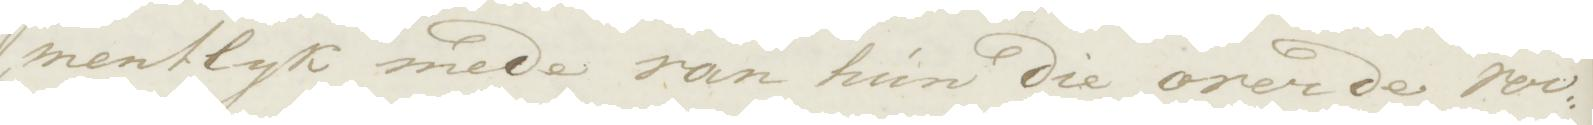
„mentlijk mede van hun die over de ver„
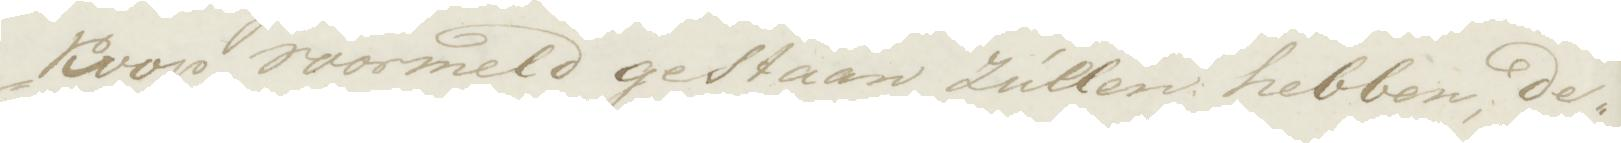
„koop voormeld gestaan zullen hebben, de„
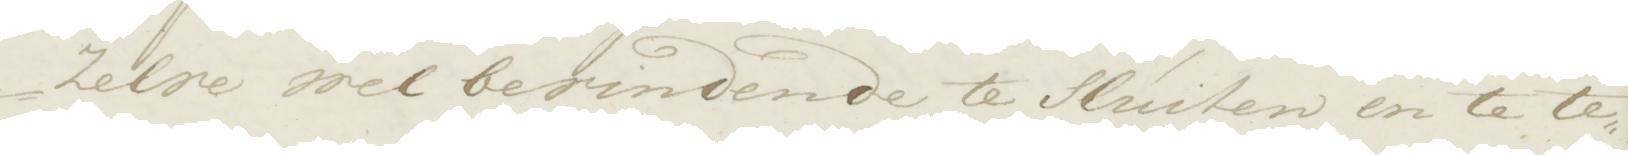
„zelve wel bevindende te sluiten en te te„
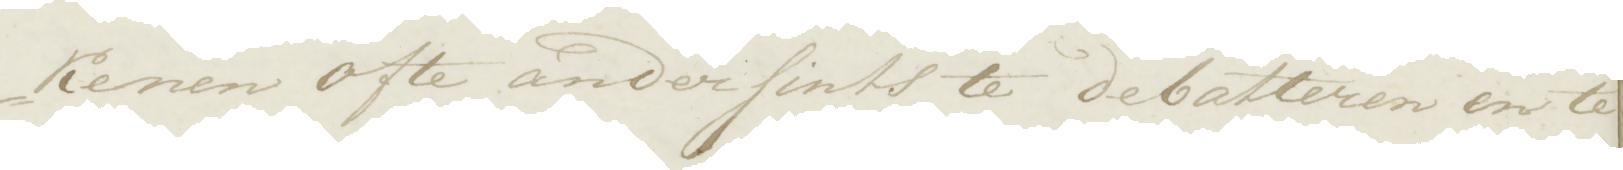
„kenen ofte andersints te debatteren en te
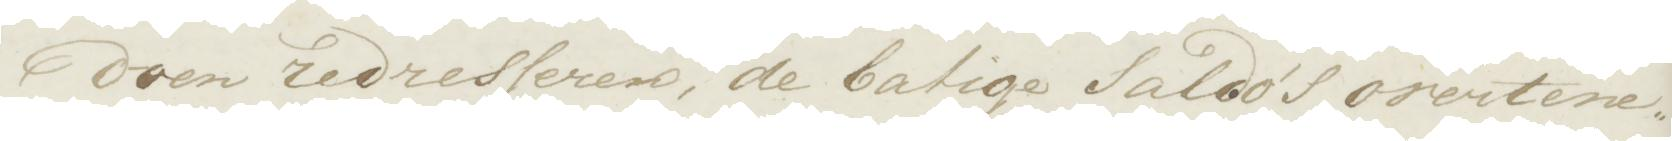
doen redresseren, de batige saldo’s overtene„
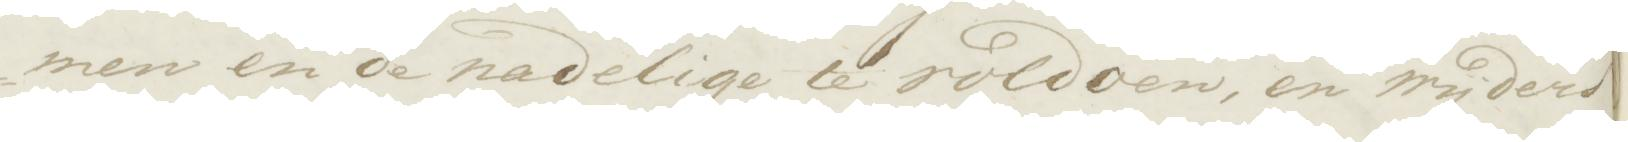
„men en de nadelige te voldoen, en wijders
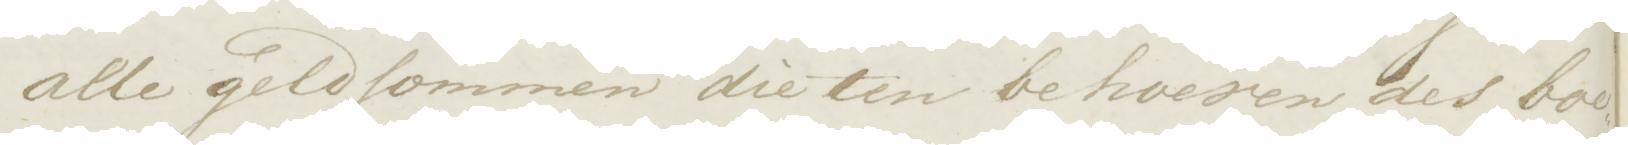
alle geldsommen die ten behoeven des boe„
